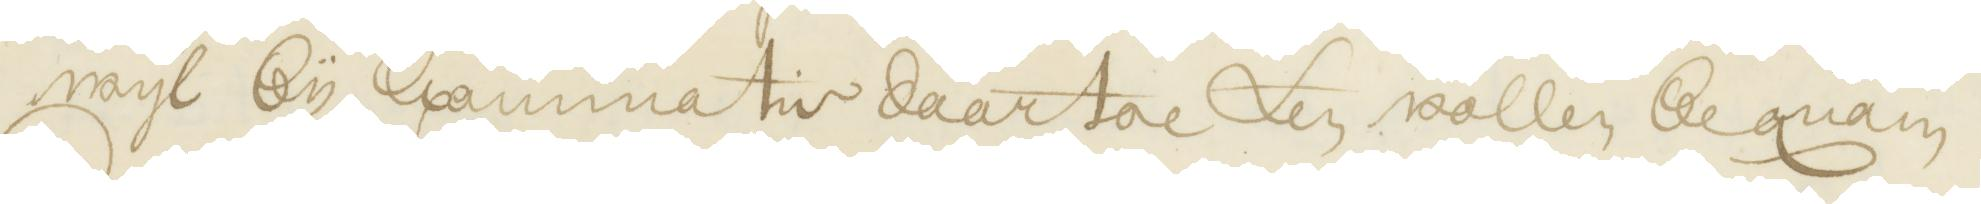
wijl bij Examinatie daar toe ten vollen bequam
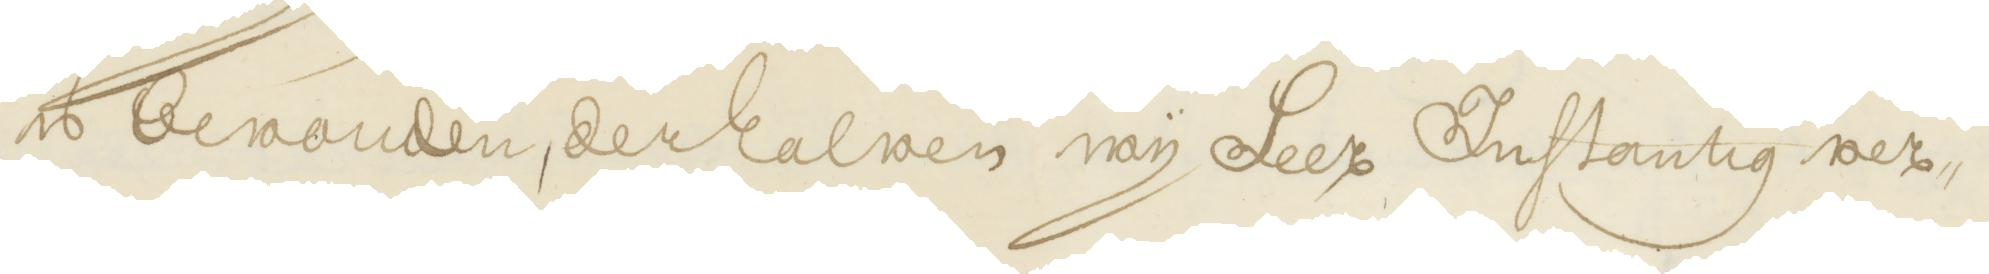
is bevonden, derhalven wij Seer Instantig ver„
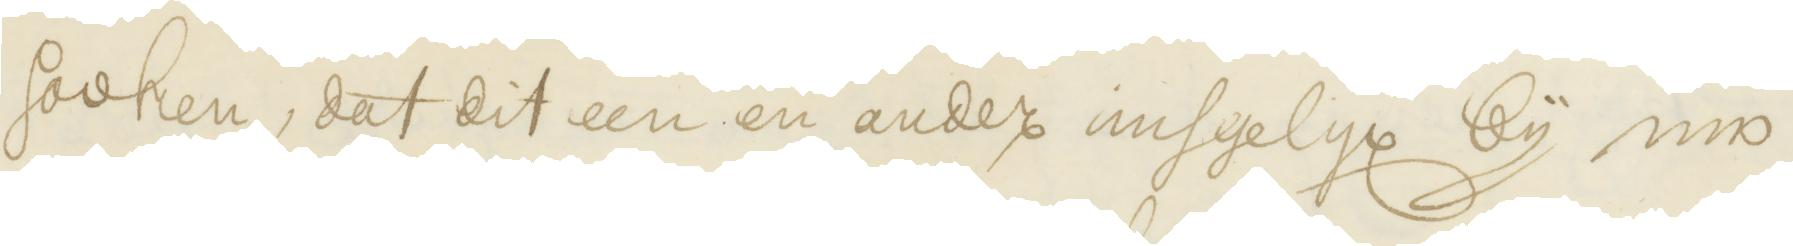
soeken, dat dit een en ander insgelijx bij uw
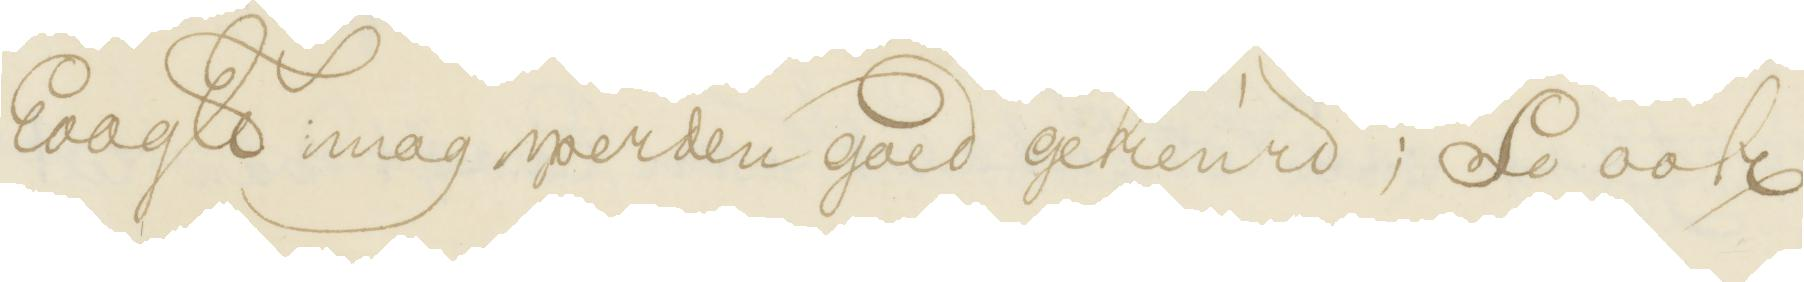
hoog Ed:s mag werden goed gekeurd; so ook
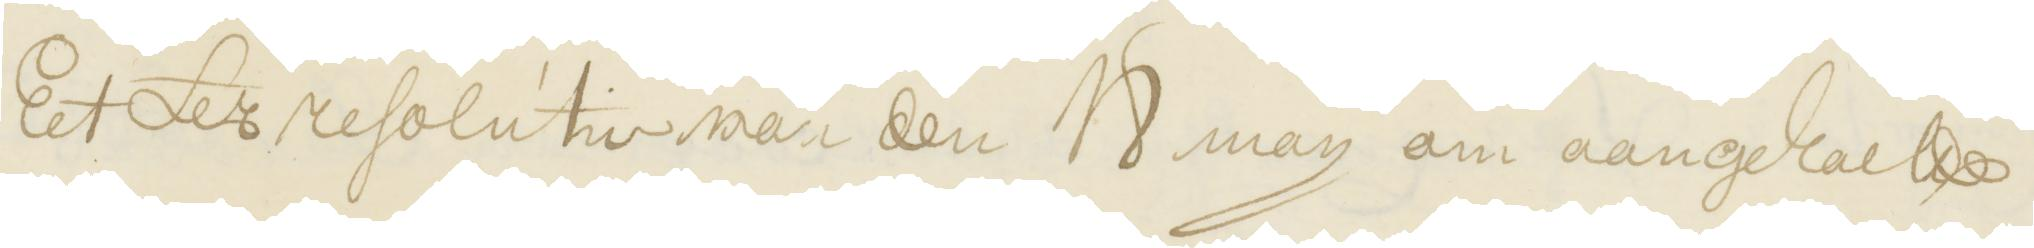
het ter resolutie van den 18 maij om aangehaelde
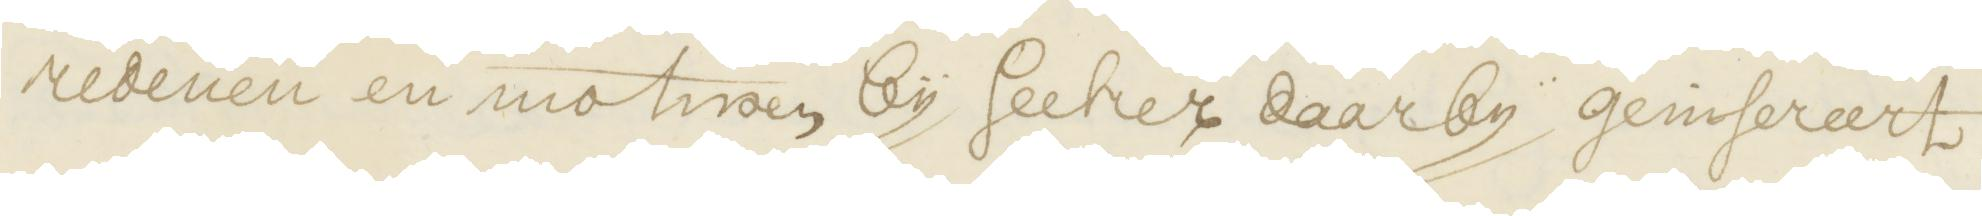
redenen en motiven bij seeker daarbij geinsereert
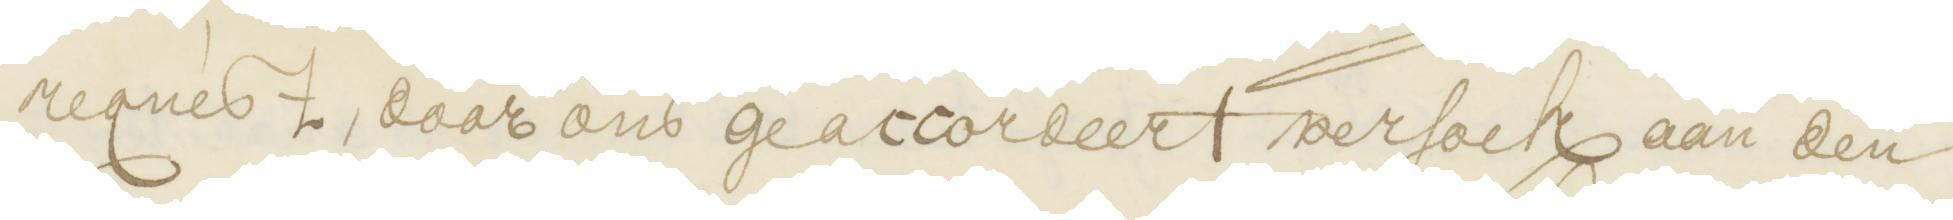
request, door ons geaccordeert versoek aan den
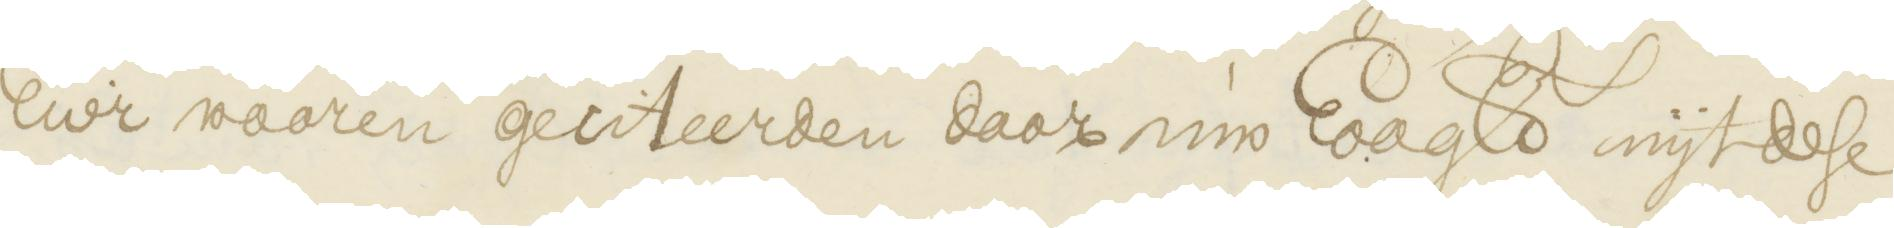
hier vooren geciteerden daar uw hoog Ed:s uijt dese
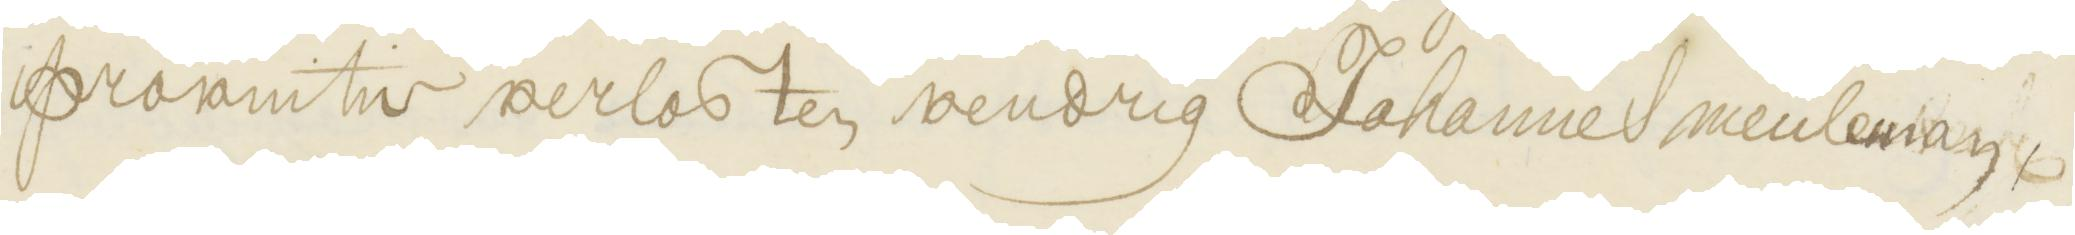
provintie verlosten vendrig Iohannes meuleman,
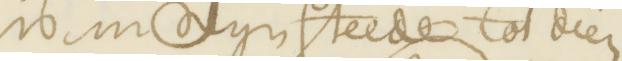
is in Sijn steede tot dien
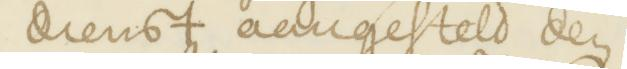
dienst aangesteld den
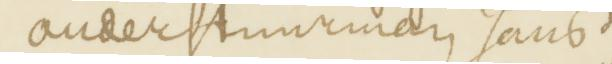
onderstuurman Jans
